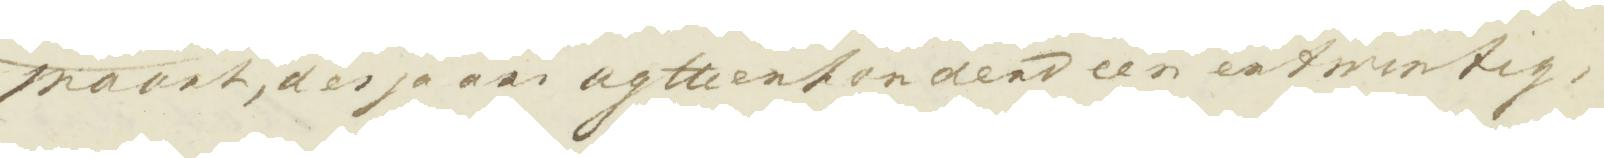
maart, des jaars agttienhonderd een en twintig,
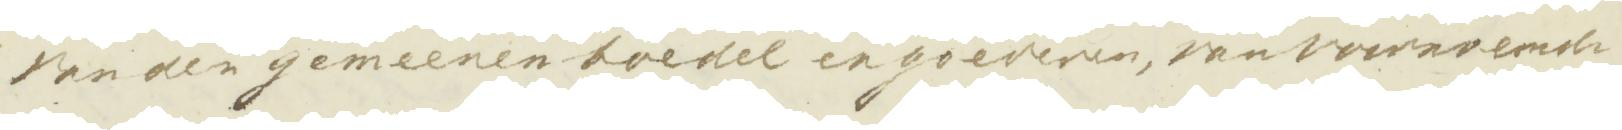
van den gemeenen boedel en goederen, van voernoemde
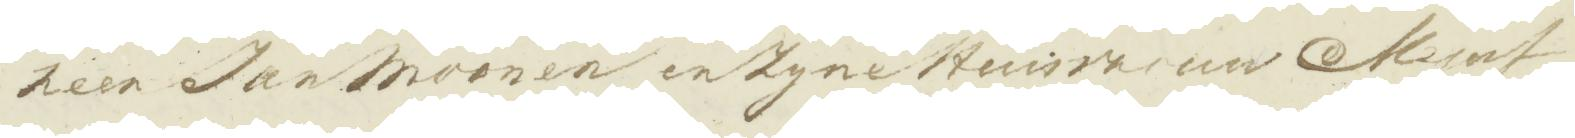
heer Ian Moonen en zyne Huisvrouw Mejuf
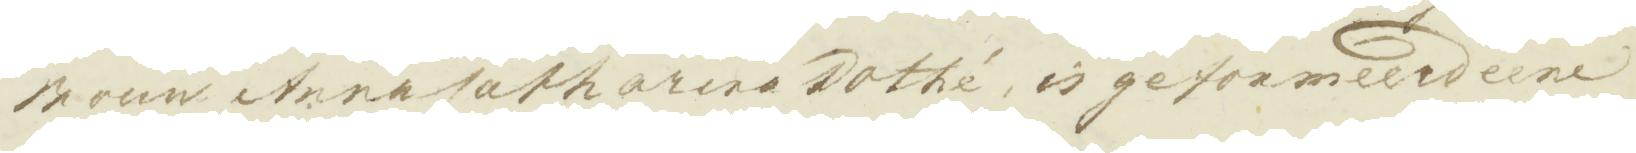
vrouw Anna Catharina Dothé, is geformeerd eene
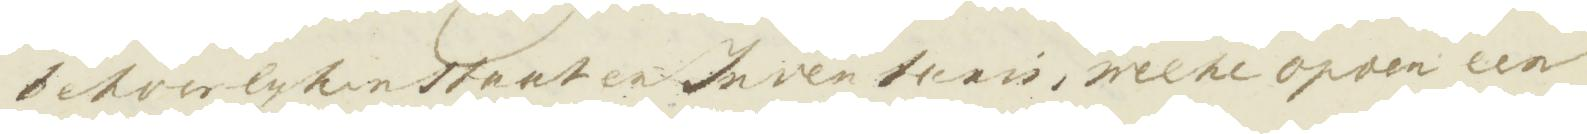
behoerlyken staat en Inventaris, welke op den een
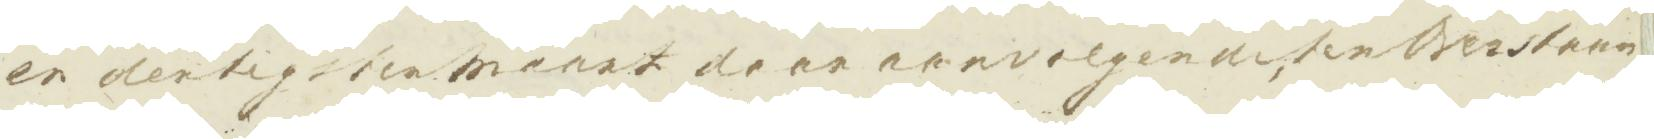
en dertigsten maart daar aanvolgende, ten Overstaan
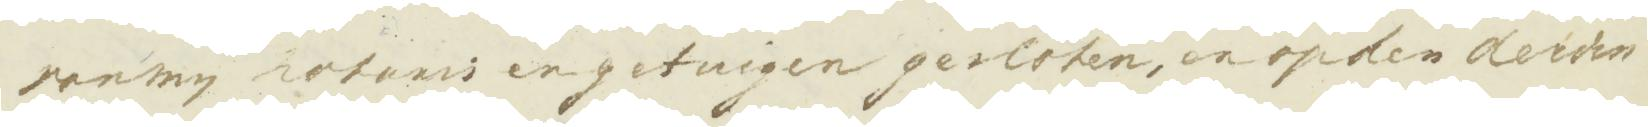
van mij notaris en getuigen gesloten, en op den derden
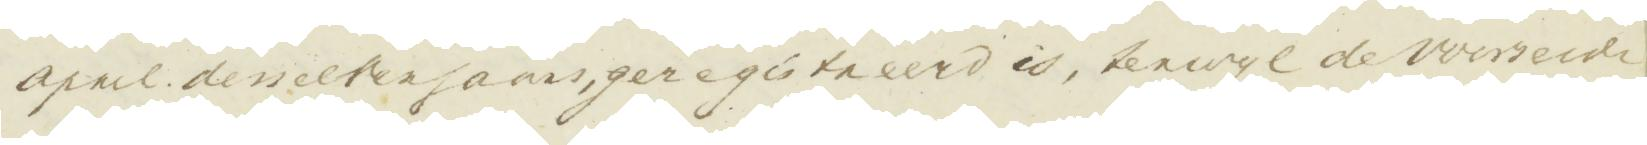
april dewelker jaars, geregistreerd is, terwyl de voerzeide
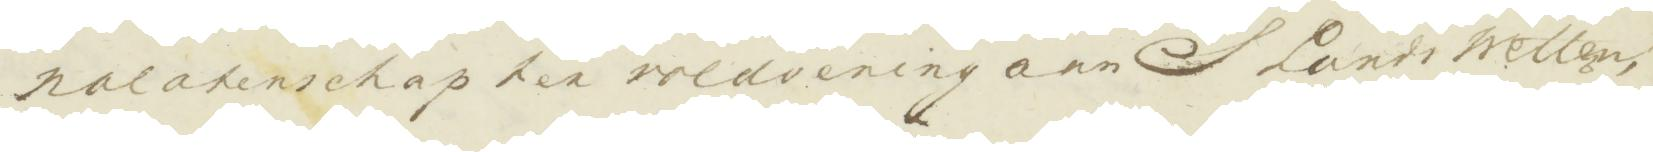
nalatenschap ter voldoening aan 's Lands wetten,
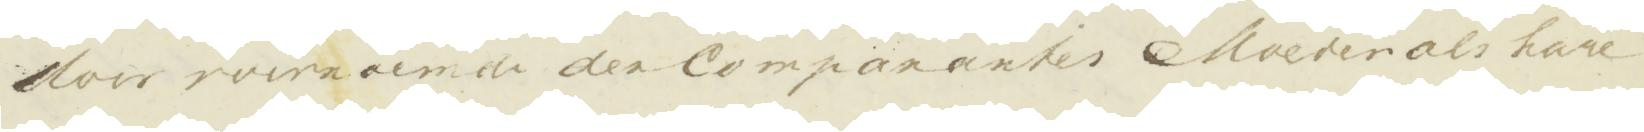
door voernoemde der comparantes Moeder als hare
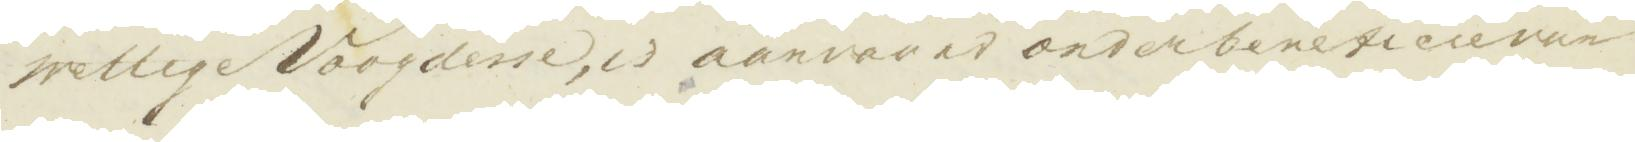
wettige Voogdesse, is aanvaard onder beneficie van
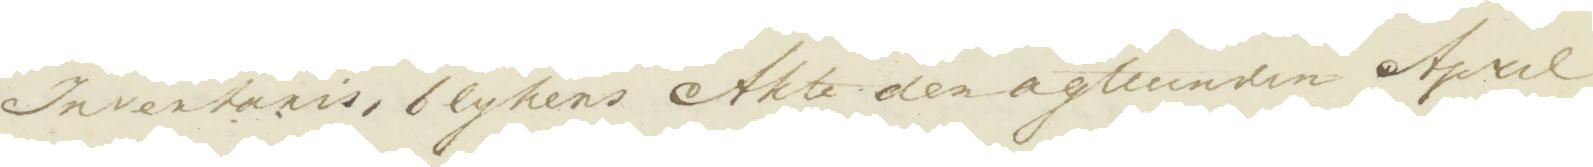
Inventaris, blykens Akte der agttienden April
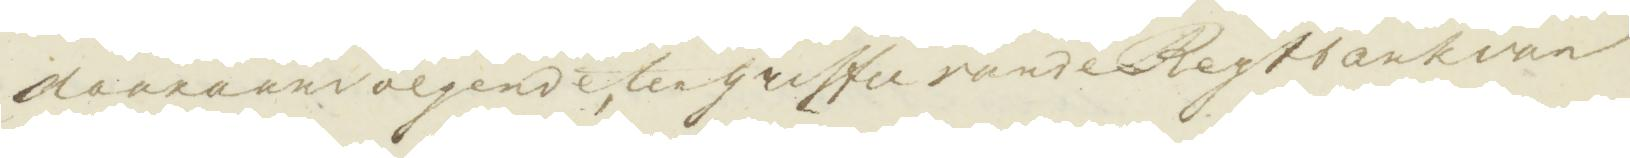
daaraan volgende, ter griffie vande Regtbank van
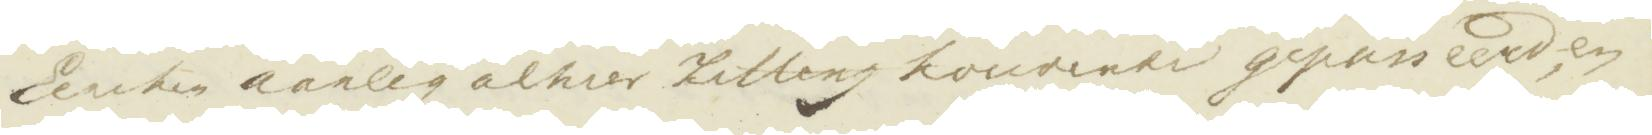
Eersten aanleg alhier zitting houdende gepasseerd, en
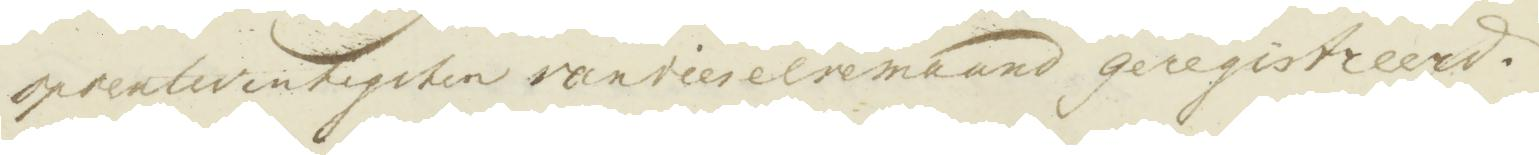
op den twintigsten van dieselve maand geregistreerd.
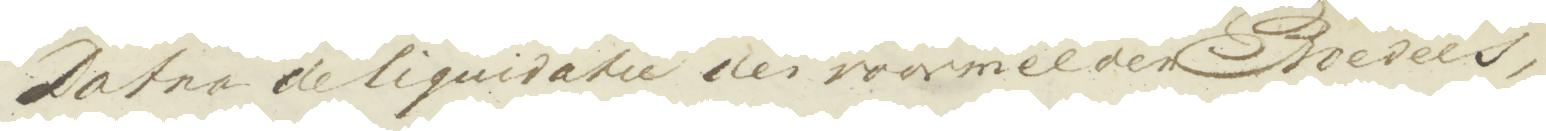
Dat na de liquidatie des voormelden Boedels,
